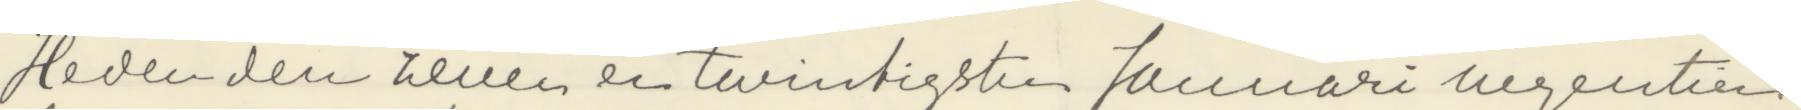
Heden den zeven en twintigsten Januari negentien
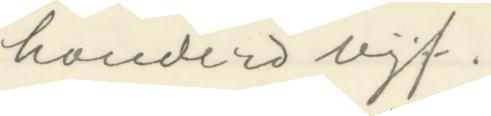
honderd vijf.
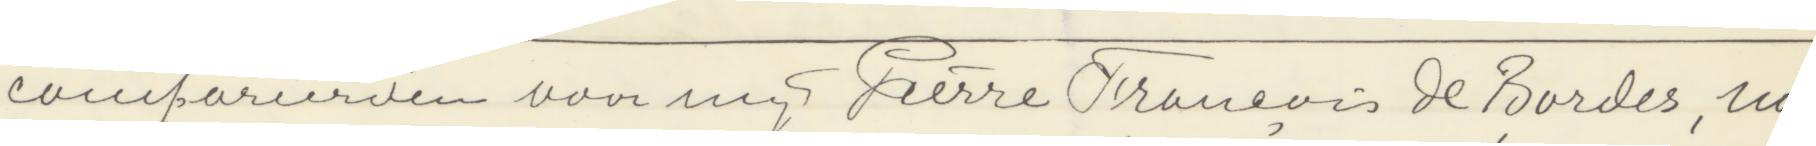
compareerden voor mij Pierre François de Bordes, no-
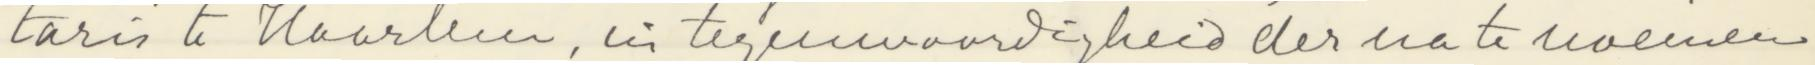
taris te Haarlem, in tegenwoordigheid der na te noemen
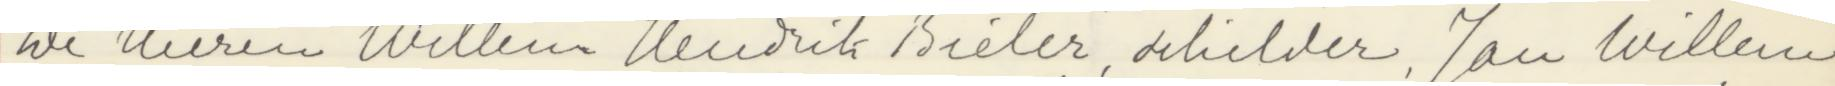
De Heeren Willem Hendrik Bieler, schilder, Jan Willem
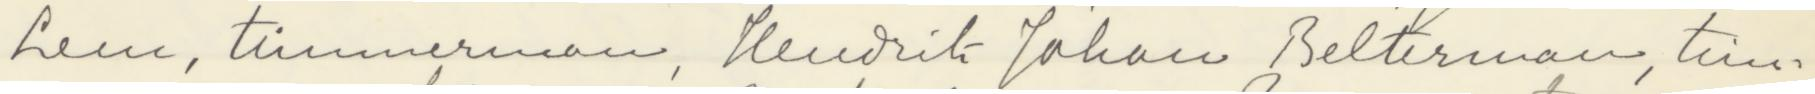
Lem, timmerman, Hendrik Johan Belterman, tim
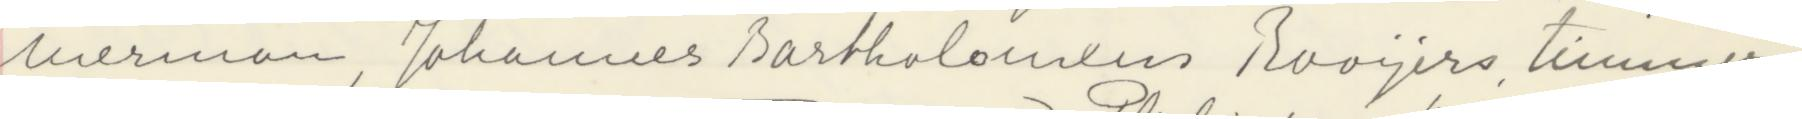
merman, Johannes Bartholomeus Rooijers, timmer-
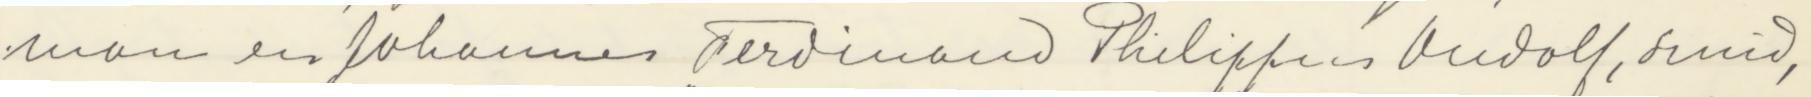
man en Johannes Ferdinand Philippus Oudolf, smid,
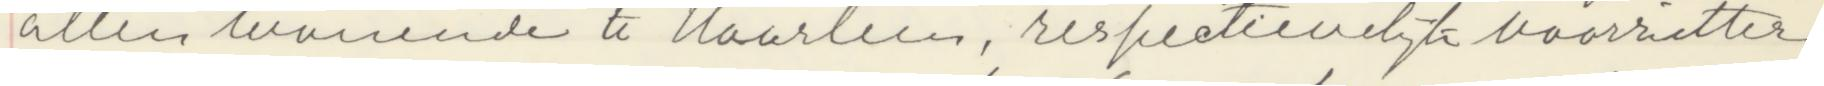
allen wonende te Haarlem, respectievelijk voorzitter
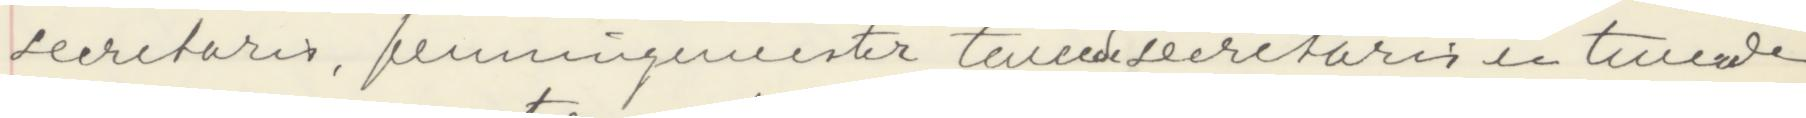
secretaris, penningmeester, tweede secretaris en tweede
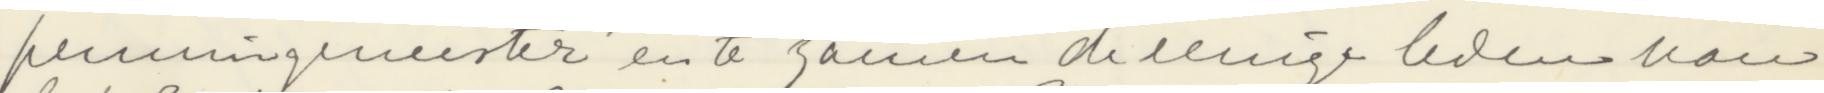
penningmeester en te zamen de eenige leden van
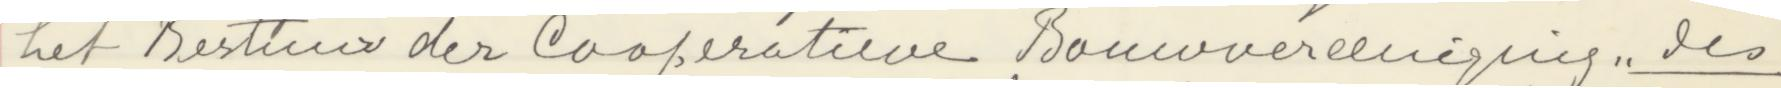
het Bestuur der Cooperatieve Bouwvereeniging „des
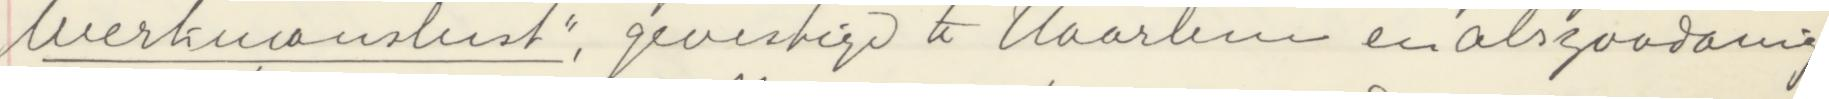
Werkmanslust", gevestigd te Haarlem en als zoodanig
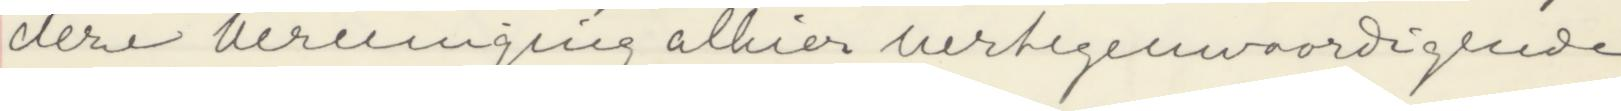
deze vereeniging alhier vertegenwoordigende
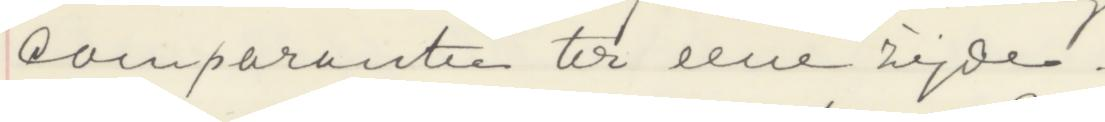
Comparanten ter eene zijde.
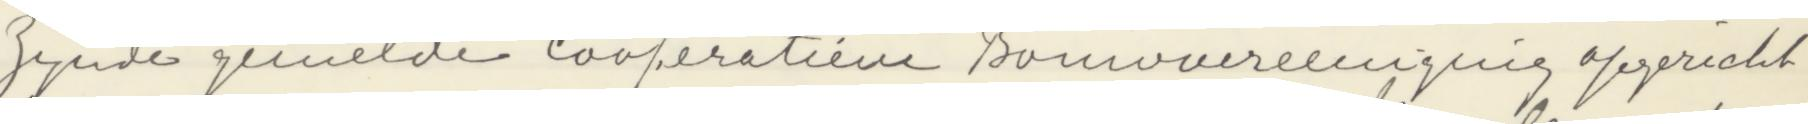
Zijnde gemelde Cooperatieve Bouwvereeniging opgericht
